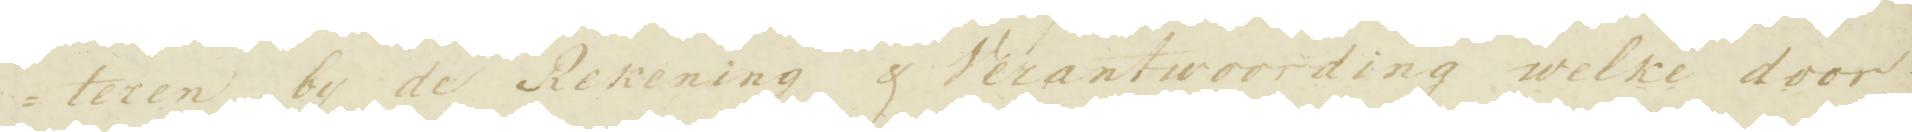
=teren by de Rekening & Verantwoording welke door
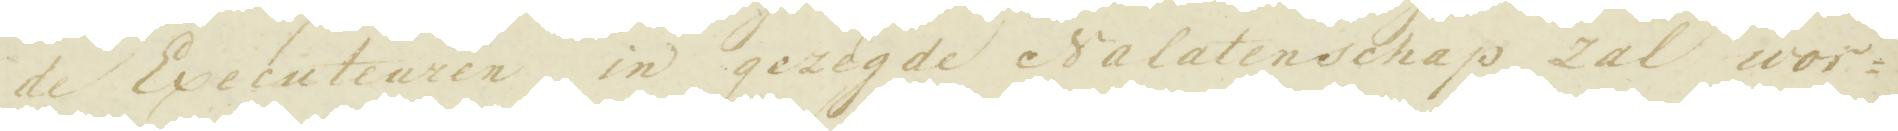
de Executeuren in gezegde Nalatenschap zal wor=
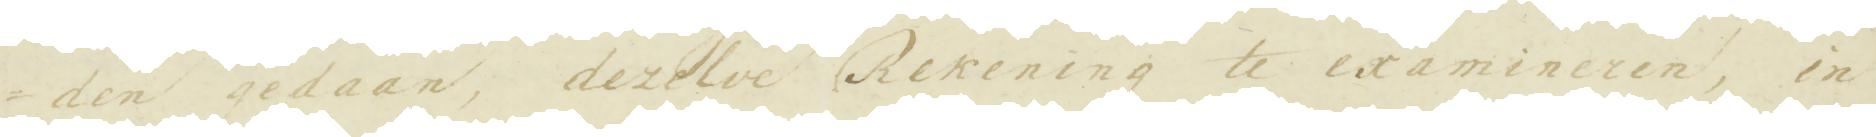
=den gedaan, dezelve Rekening te examineren, en
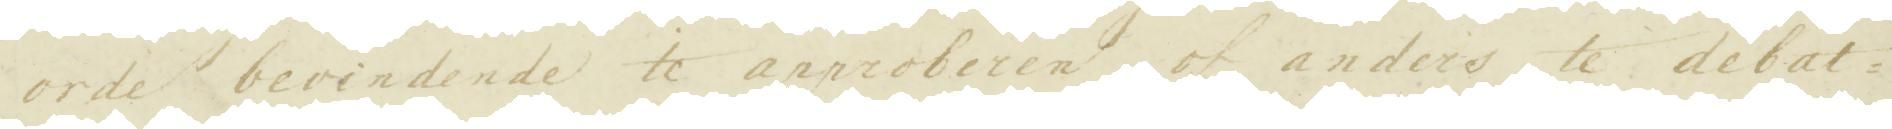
orde bevindende te approberen of anders te debat=
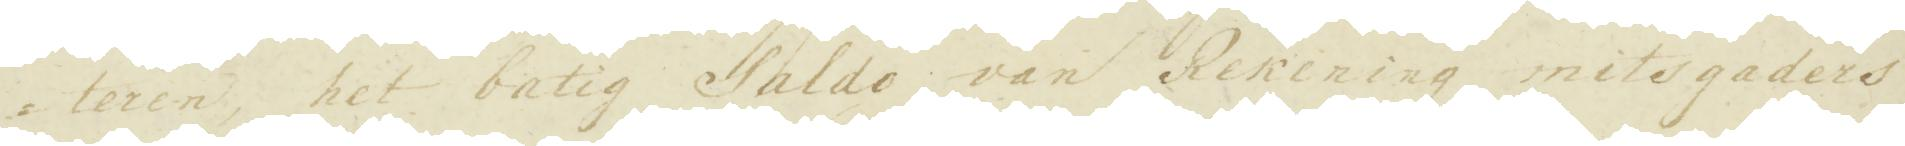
=teren, het batig saldo van Rekening mitsgaders
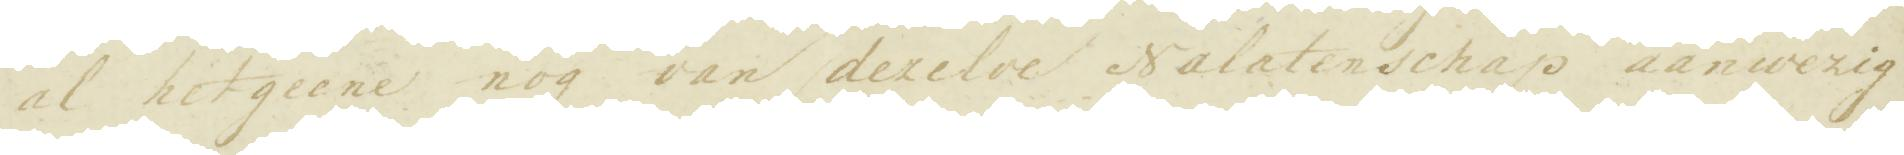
al hetgeene nog van dezelve Nalatenschap aanwezig
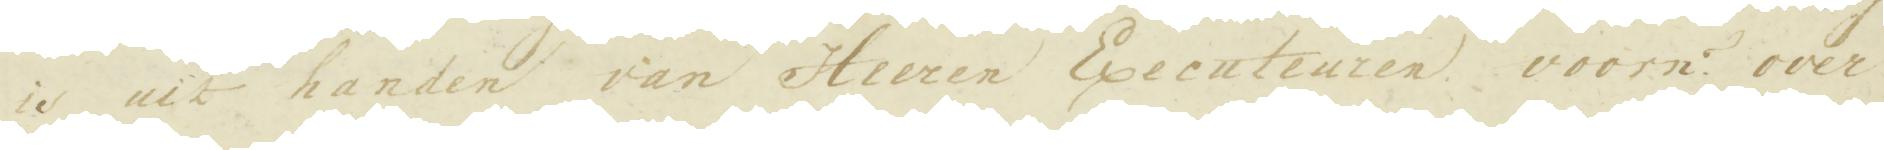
is uit handen van Heeren Executeuren voorn: over
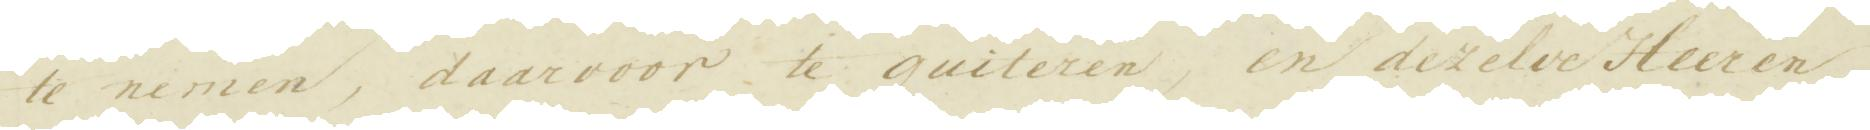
te nemen, daarvoor te quiteren, en dezelve Heeren
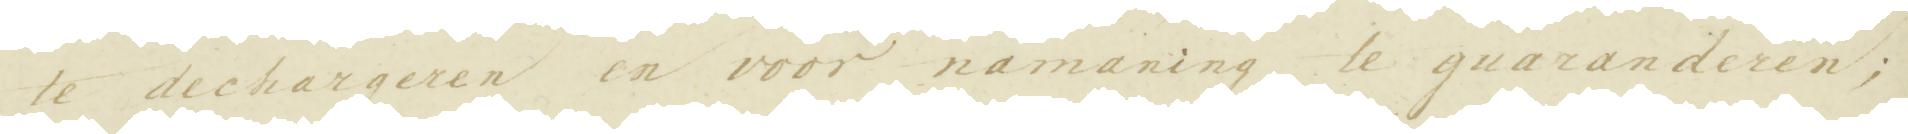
te dechargeren en voor namaning te guaranderen;
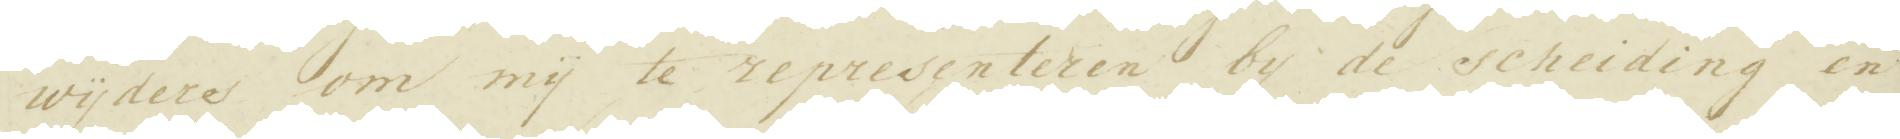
wijders om mij te representeren by de scheiding en
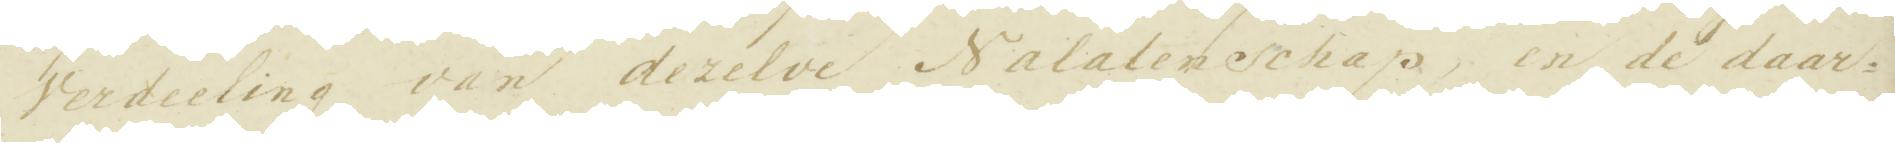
Verdeeling van dezelve Nalatenschap, en de daar=
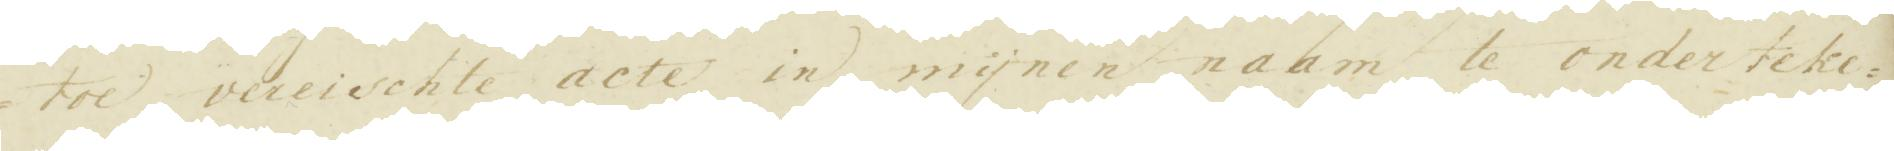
=toe vereischte acte in mijnen naam te onderteke=
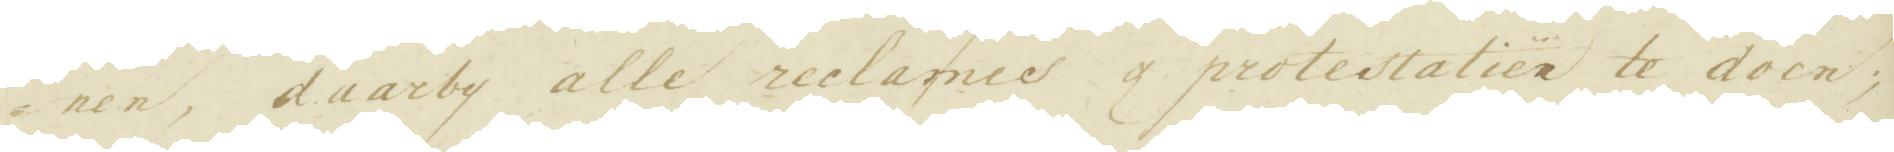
=nen, daarby alle reclames & protestatiën te doen;
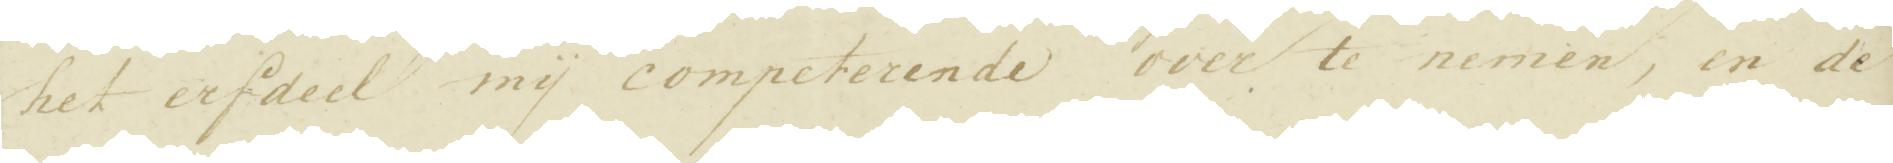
het erfdeel mij competerende over te nemen, en de
